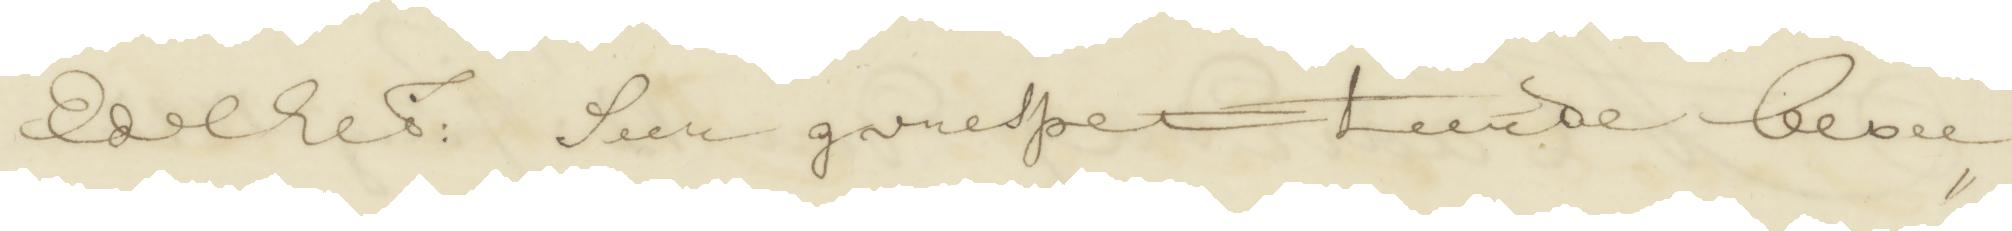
Edelhed:s seer gerespecteerde bevee„
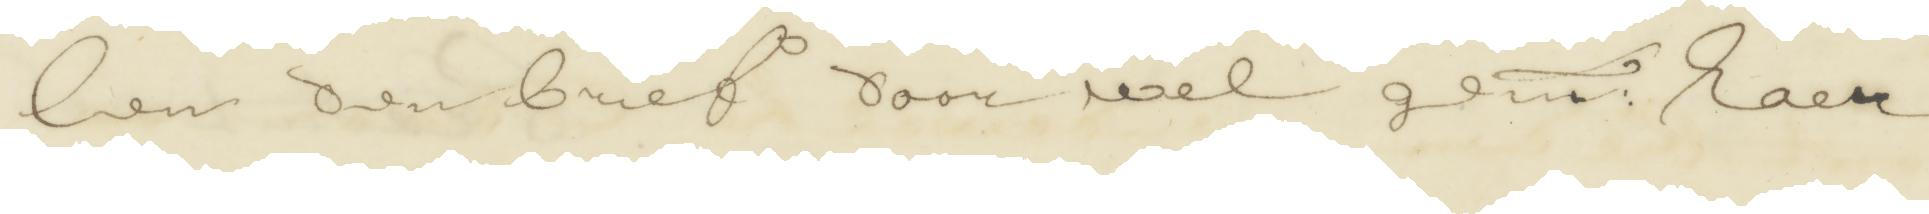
len den brief door wel gem: haer
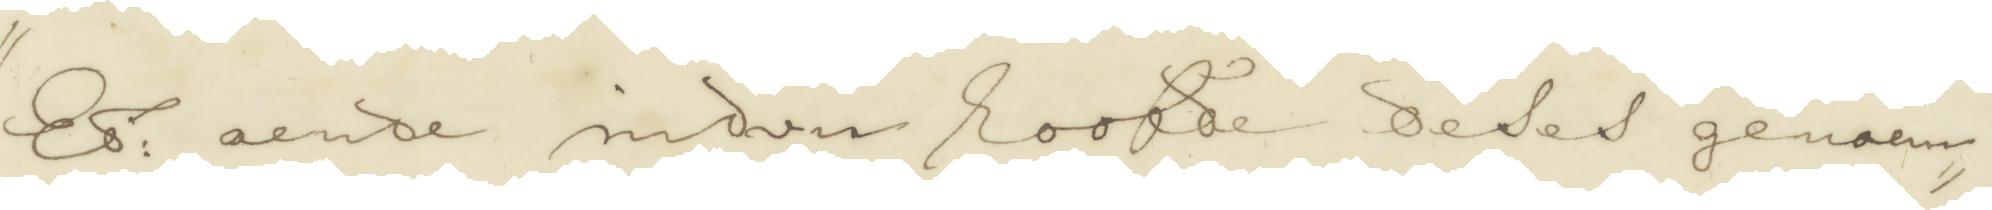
Ed:s aende in den hoofde deses genoem„
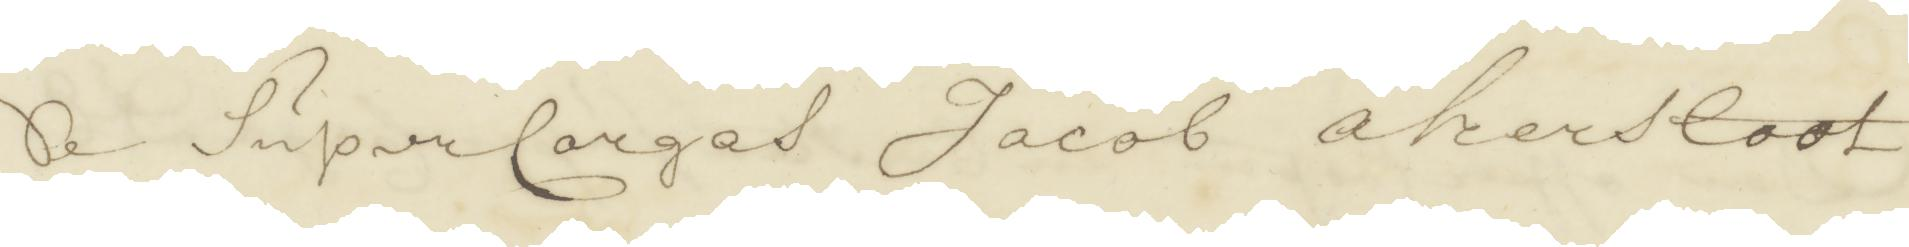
de supercargas Jacob akersloot
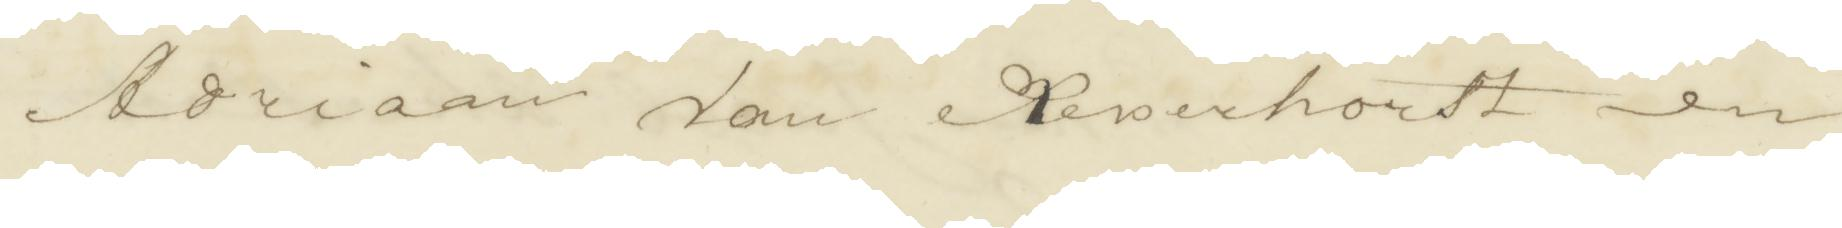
Adriaan van Reverhorst en
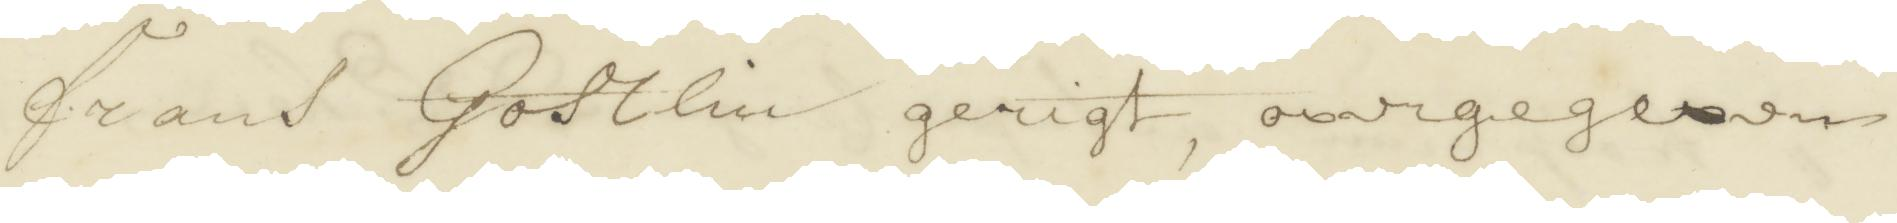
frans Gostlin gerigt, overgegeven
